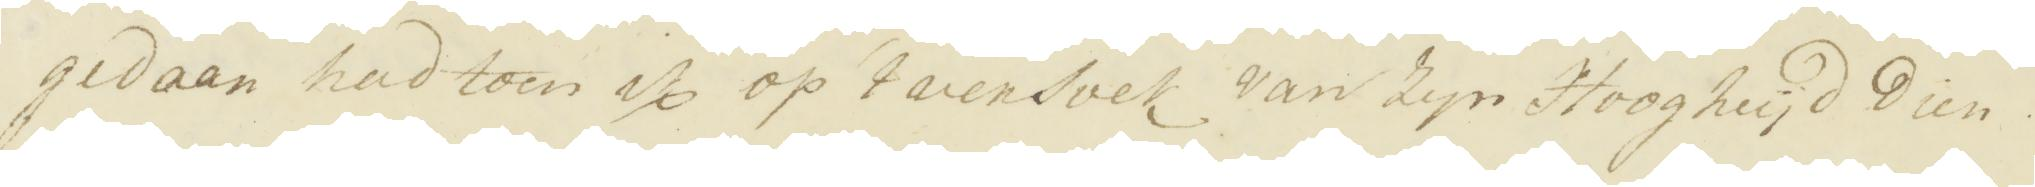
gedaan had toen ik op ’t versoek van zijn Hoogheijd dien
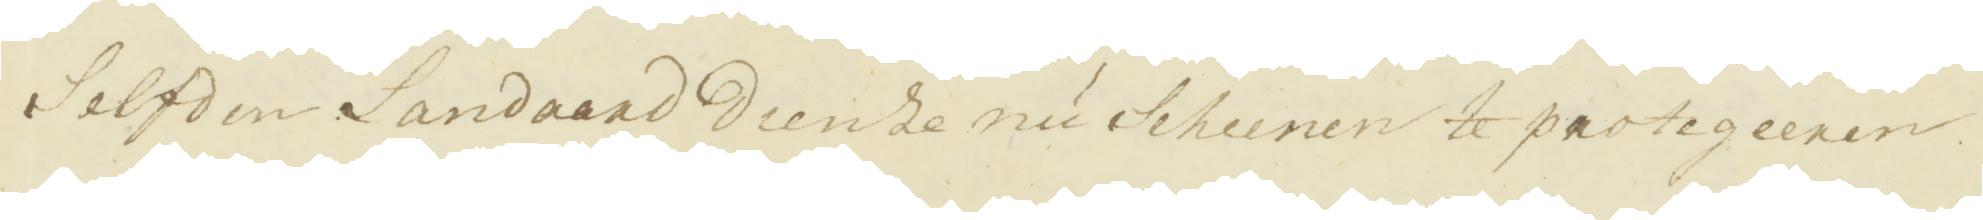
selfden landaard dienze nu scheenen te protegeeren
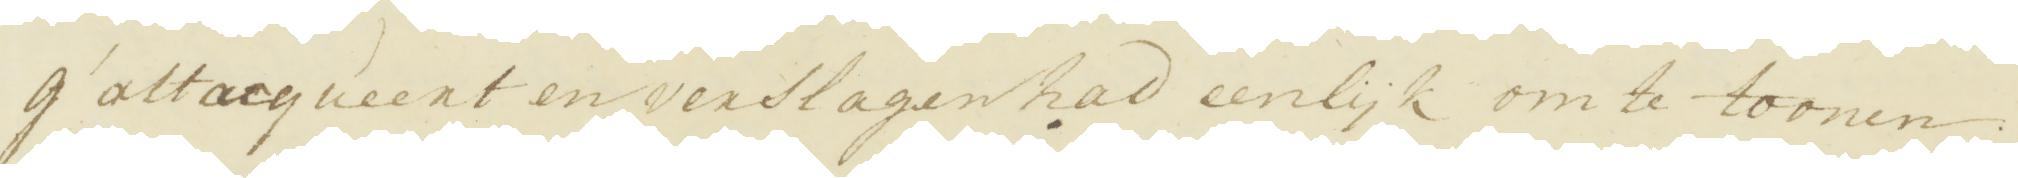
g’attacqueert en verslagen had eenlijk om te toonen
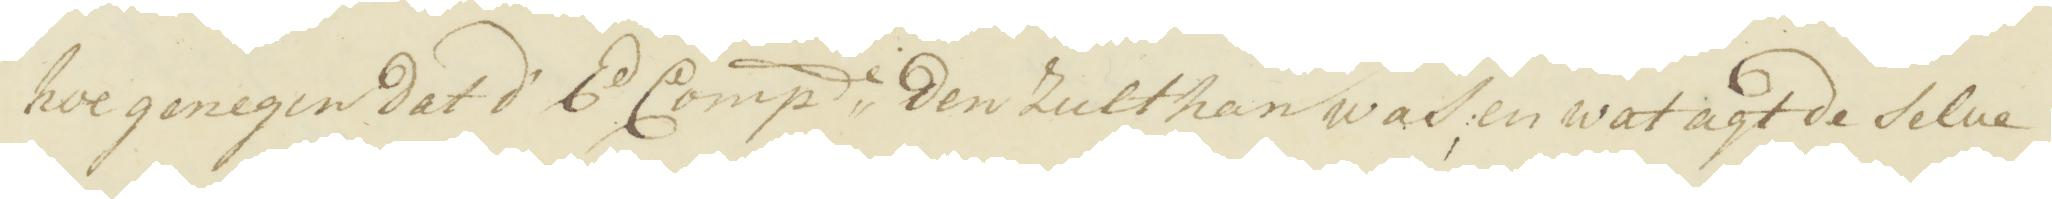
hoe genegen dat d’ E Comp„e den zulthan was, en wat agt de selve
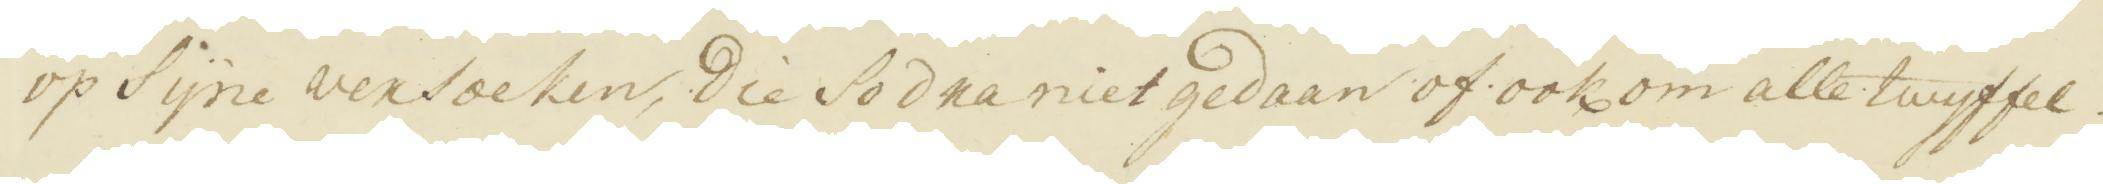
op sijne versoeken, die sodra niet gedaan of ook om alle twijffel
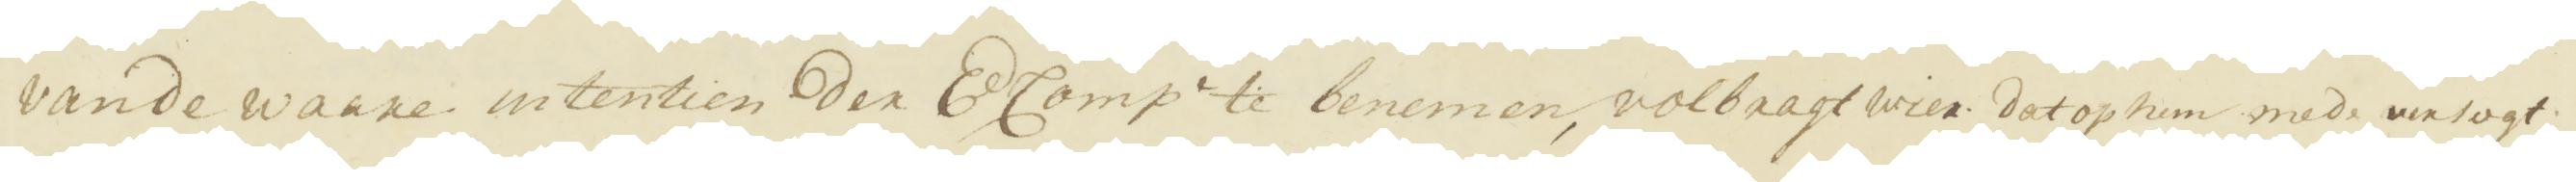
van de waare intentien der E Compe te benemen, volbragt wier dat op hem mede versogt
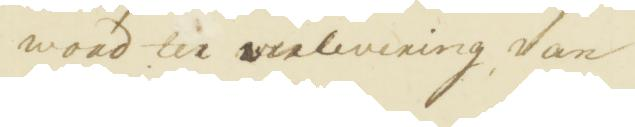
word ter verlevering van
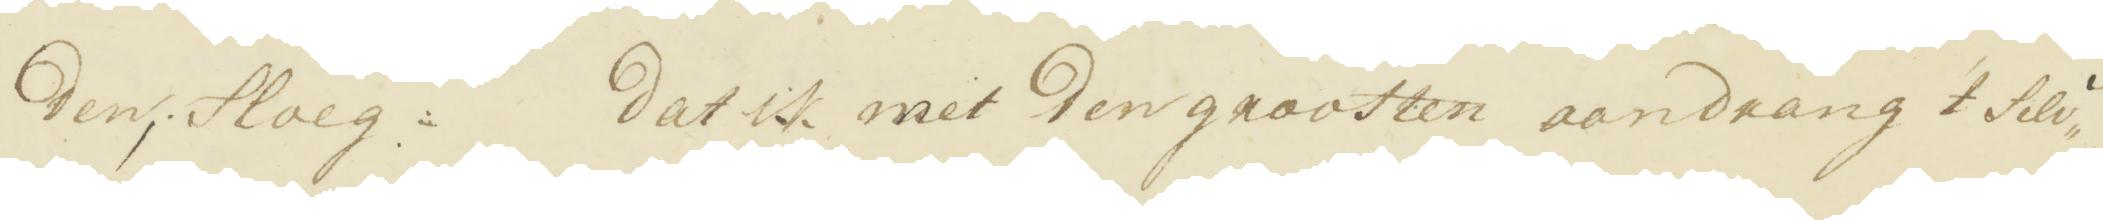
den, sloeg: dat ik met den groosten aandrang ’t selv„
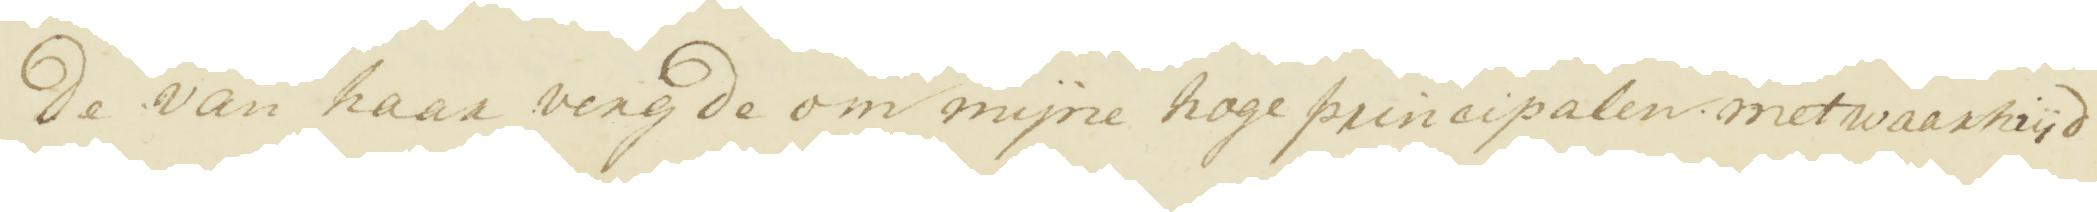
de van haar vergde om mijne hoge principalen met waarheijd
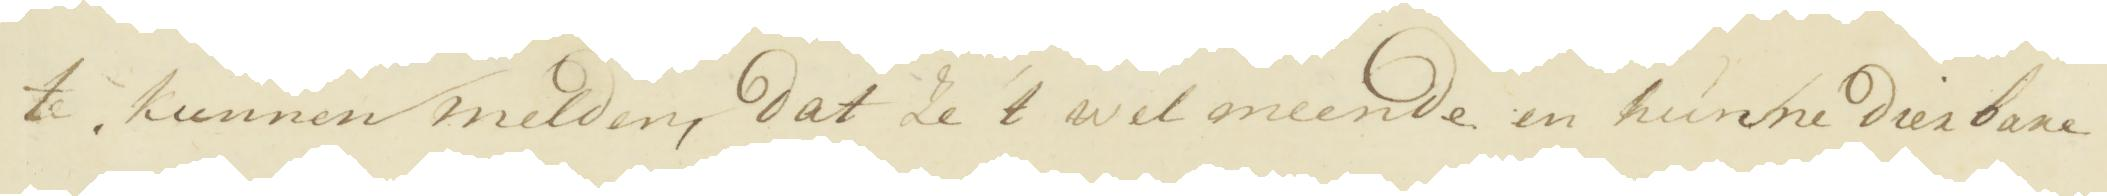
te kunnen melden, dat ze ’t wel meende en hunne dierbare
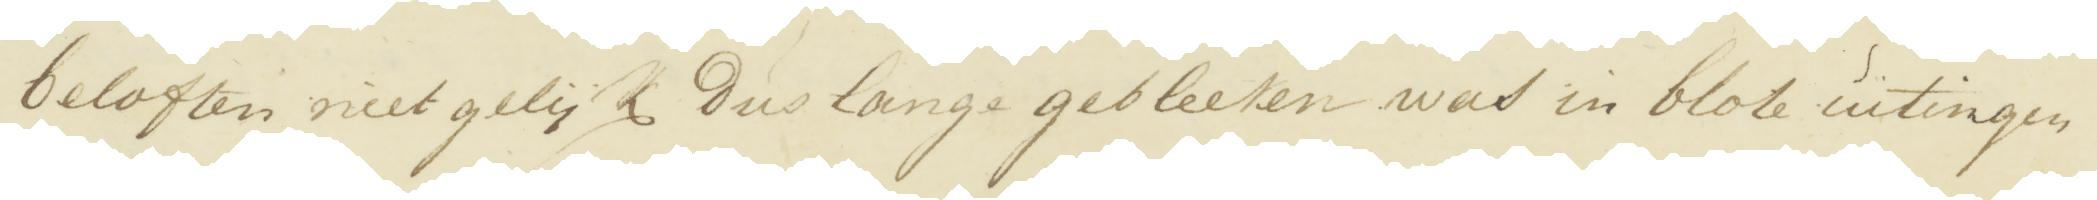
beloften niet gelijk dus lange gesleeten was in blote uitingen
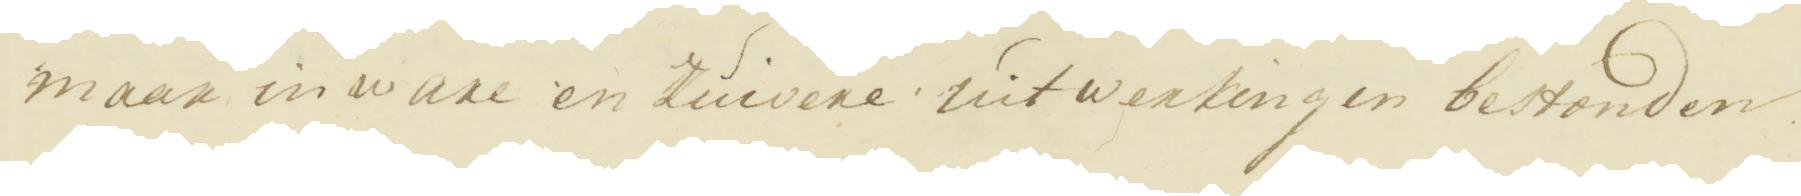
maar in ware en zuivere uitwerkingen bestonden.
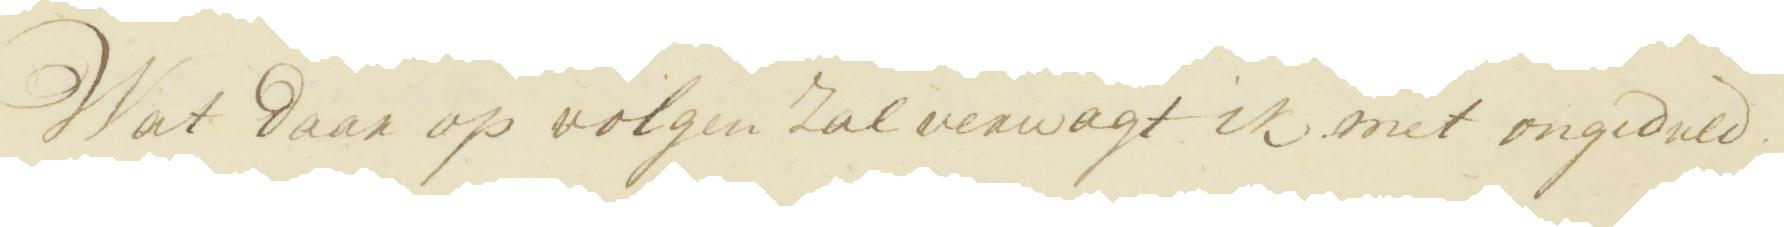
Wat daar op volgen zal verwagt ik met ongeduld.
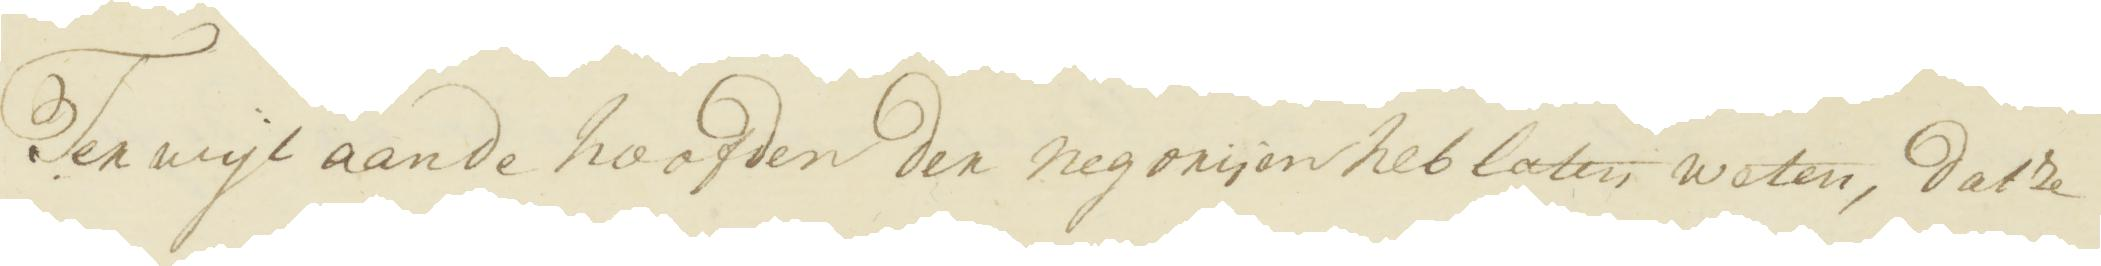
Terwijl aan de hoofden der negorijen heb laten weten, dat ze
